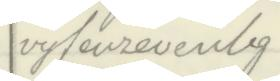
vyf enzeventig
